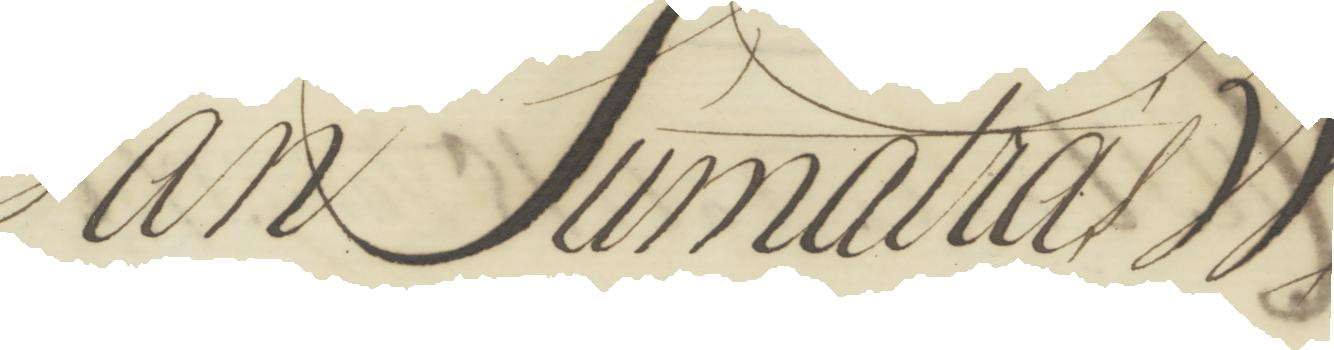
Van Sumatra's W„t
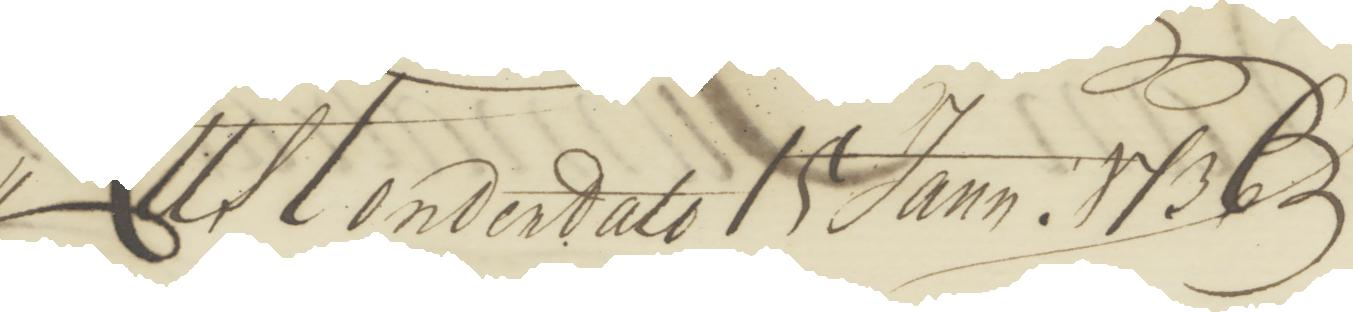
Cust onderdato 15 Iann: 1736
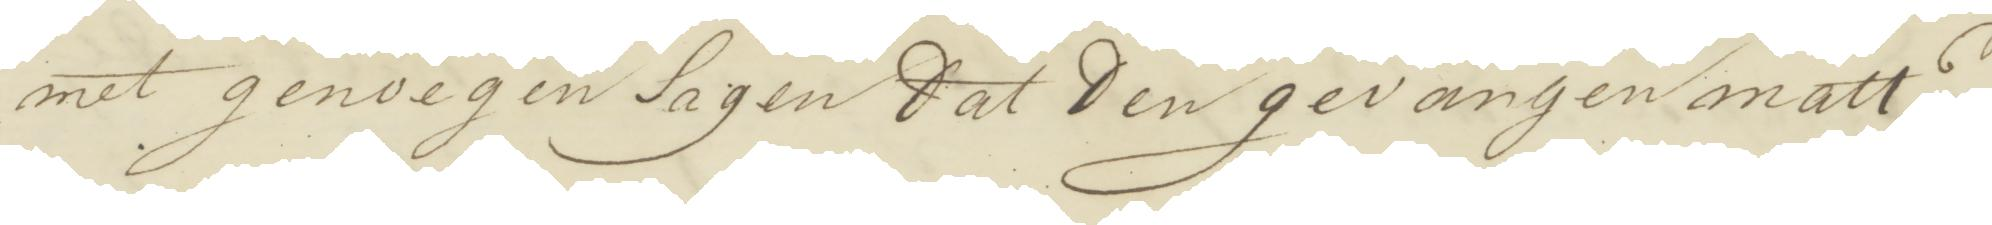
met genoegen sagen dat den gevangen matt:s
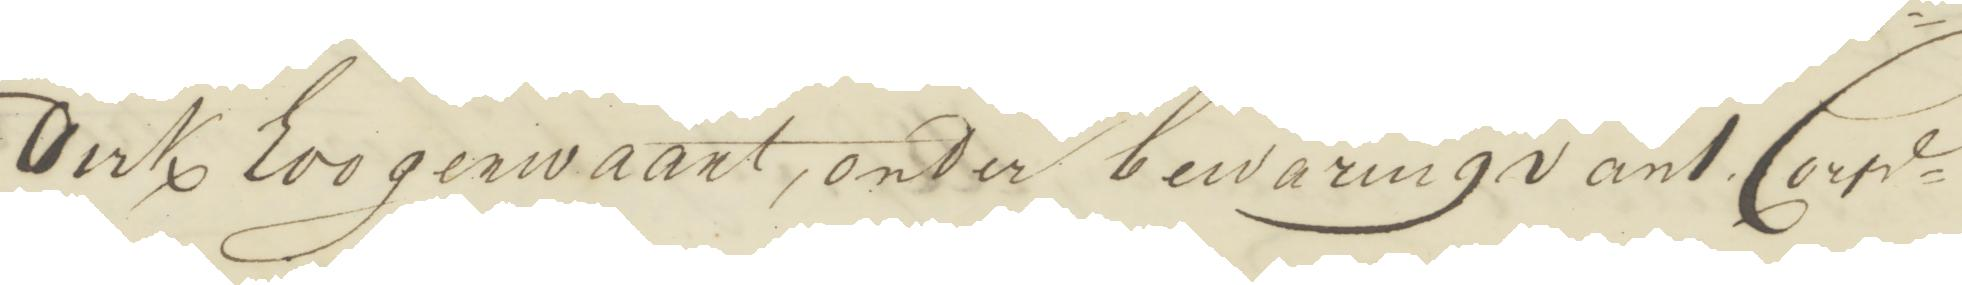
dirk hoogerwaart, onder bewaring vant. Corp:e
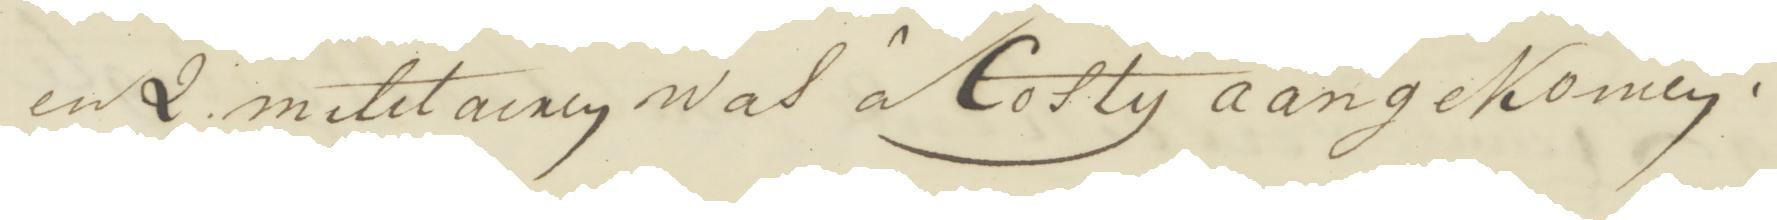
en 2. militairen was â Costy aangekomen.
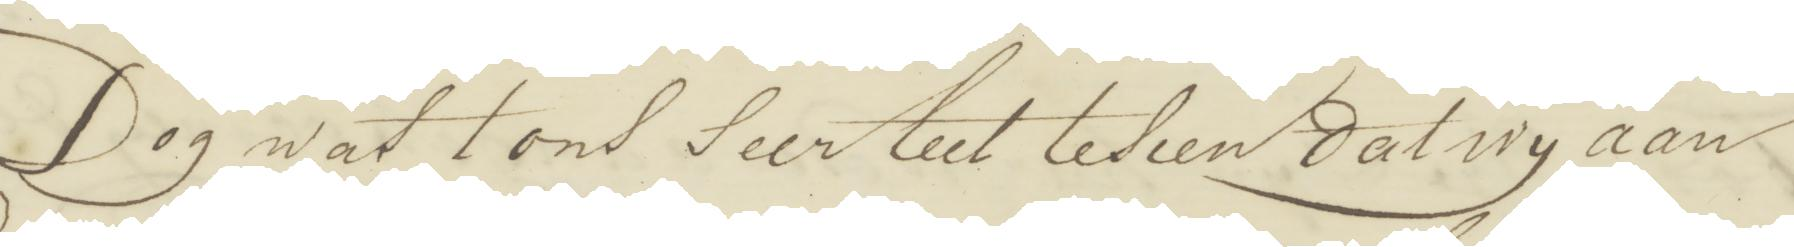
Dog wast ons seer leet te sien dat wij aan
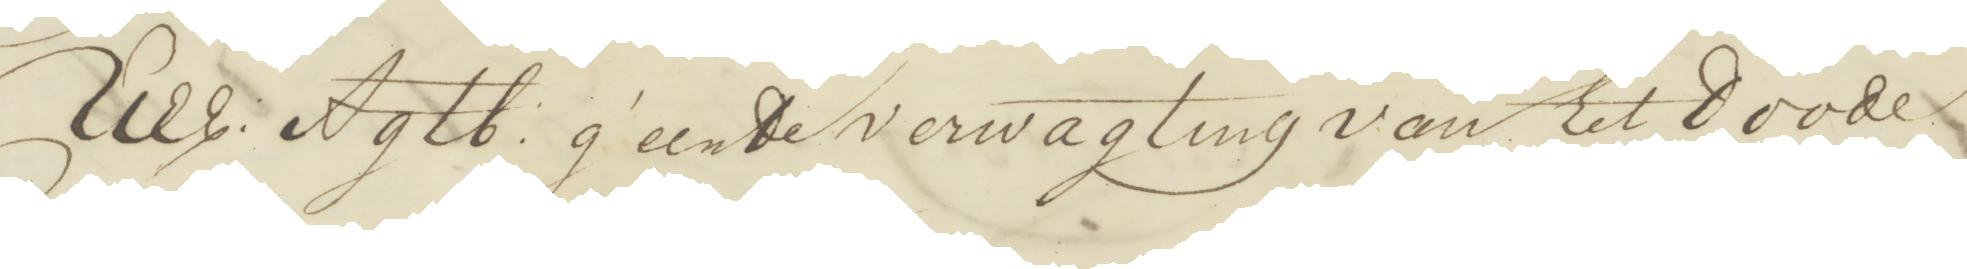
UEE: Agtb: g’eerde verwagting van het doode
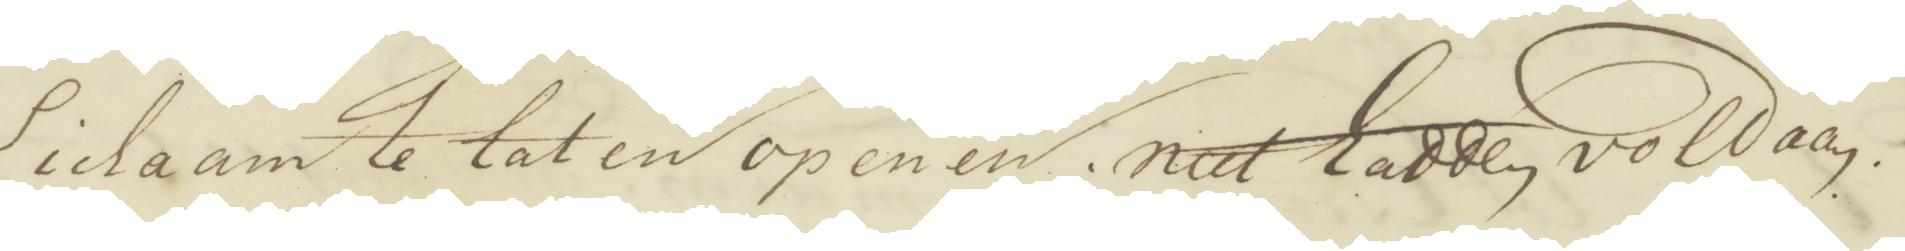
Lichaam te laten openen. niet hadden voldaan:
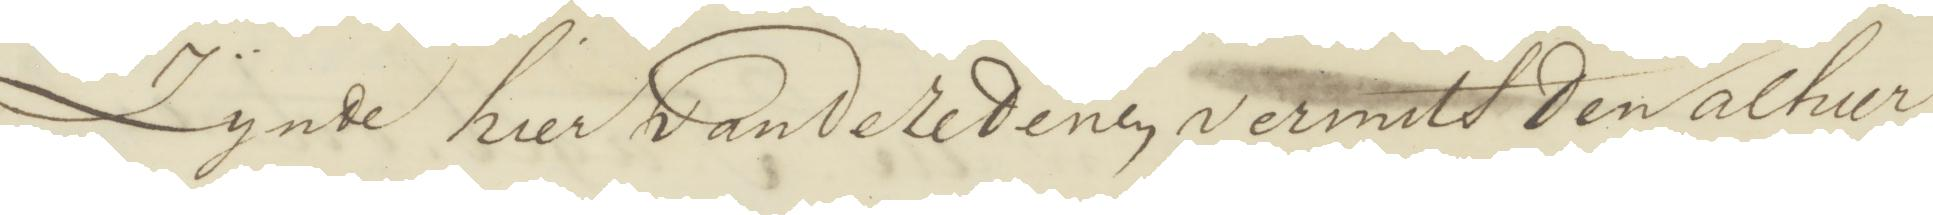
Zijnde hier van de redenen vermits den alhier
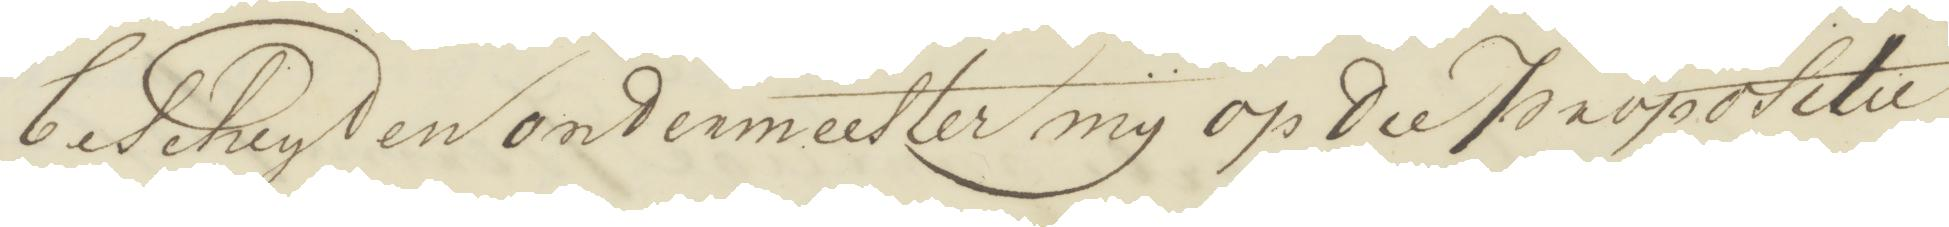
bescheyden ondermeester mij op die propositie
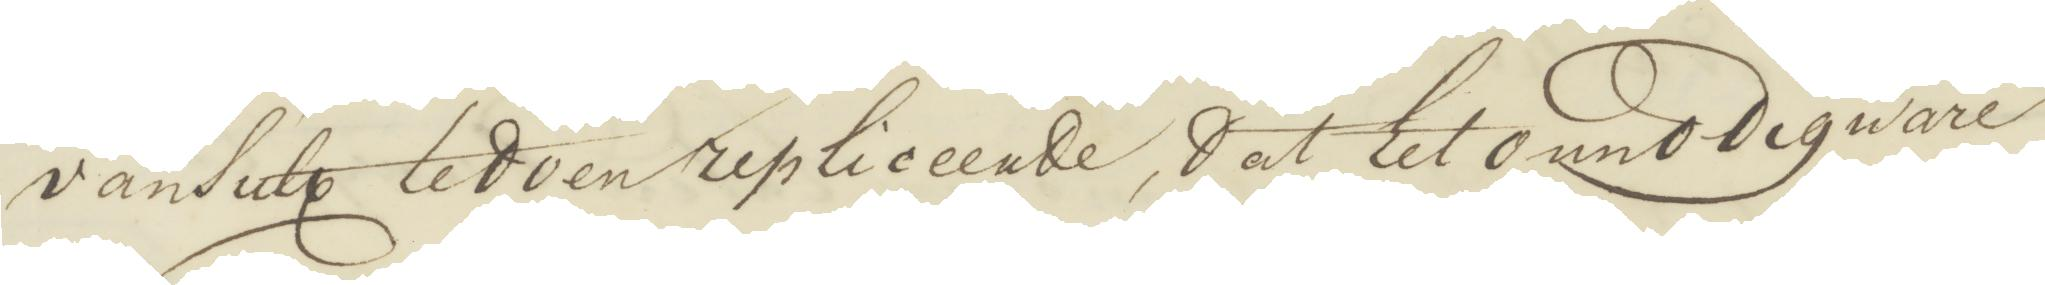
van sulx te doen repliceerde, dat het onnodig ware
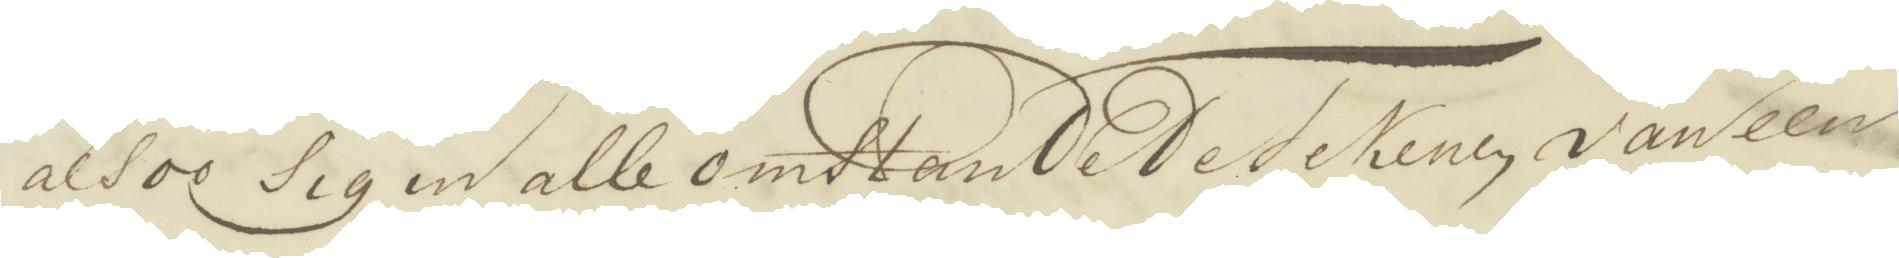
alsoo sig in alle omstande de tekenen van een
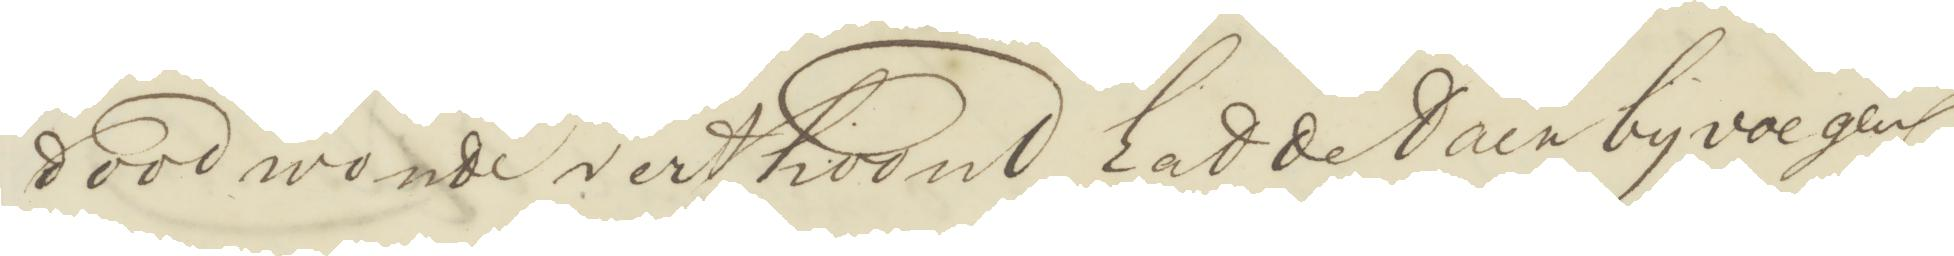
dood wonde verthoond hadde daer bijvoegen
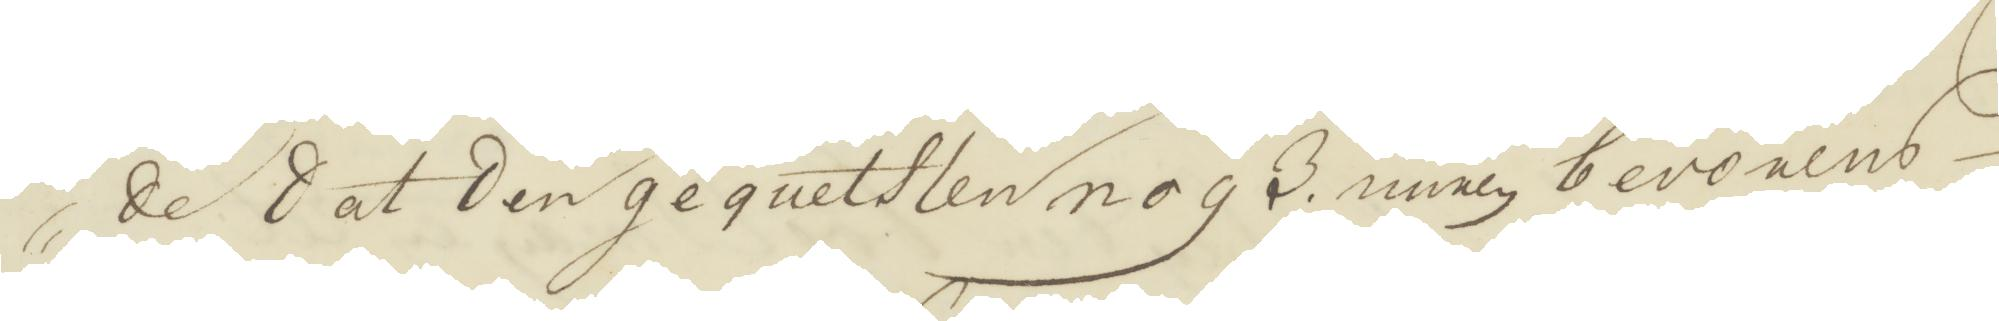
„de dat den gequetsten nog 3. uuren bevorens
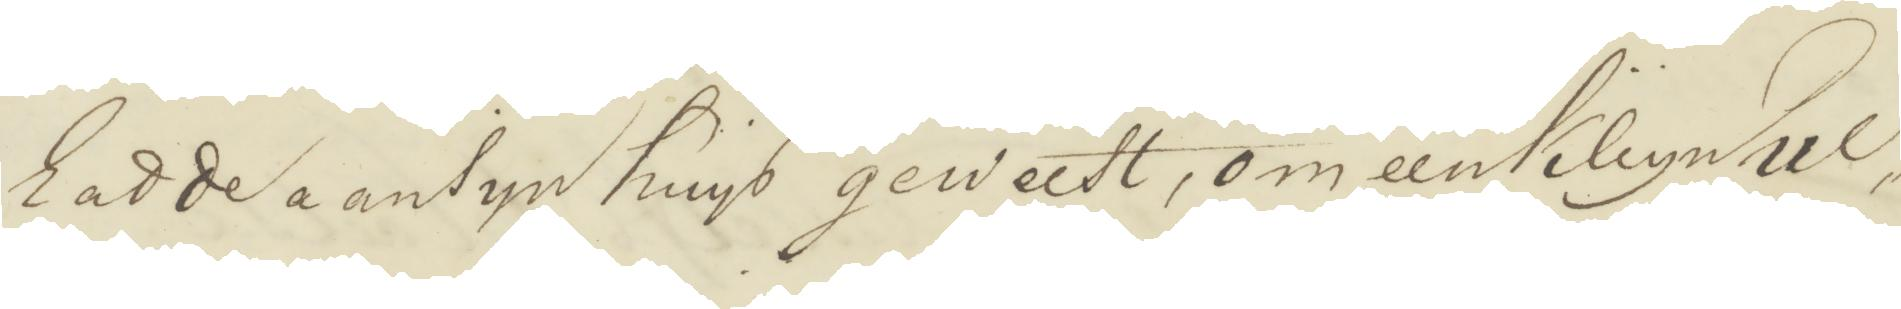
hadde aan sijn huijs geweest, om een kleijn ul„
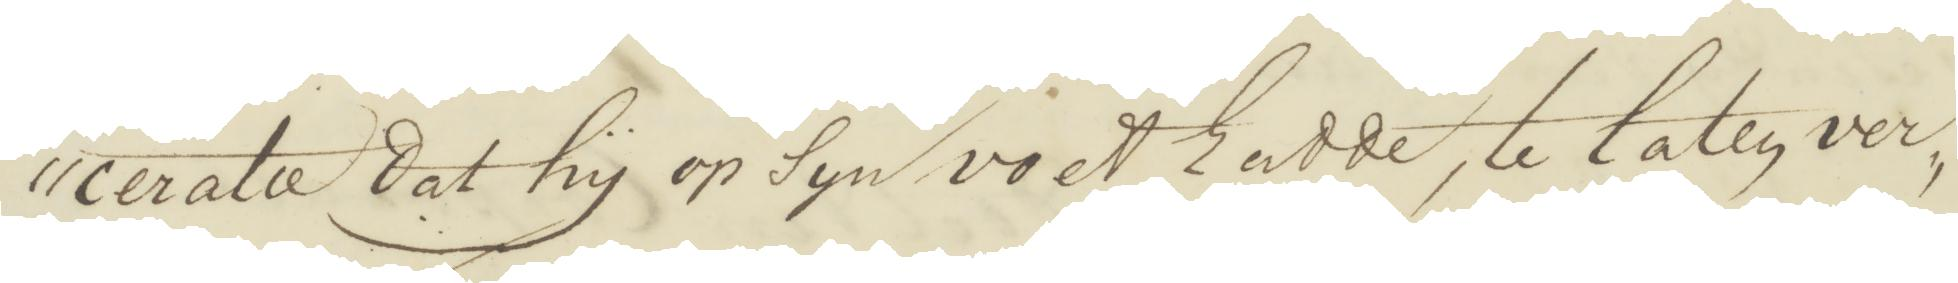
„ceratie dat hij op syn voet hadde, te laten ver„
